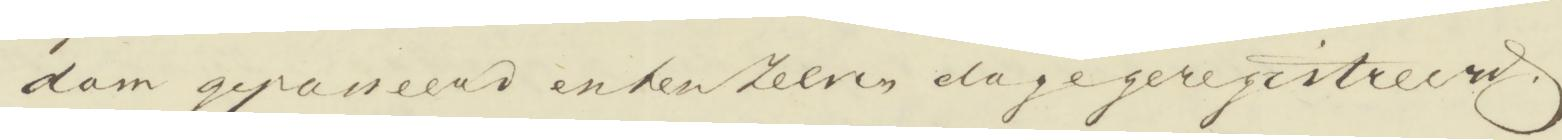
dam gepasseerd en ten zelven dage geregistreerd.
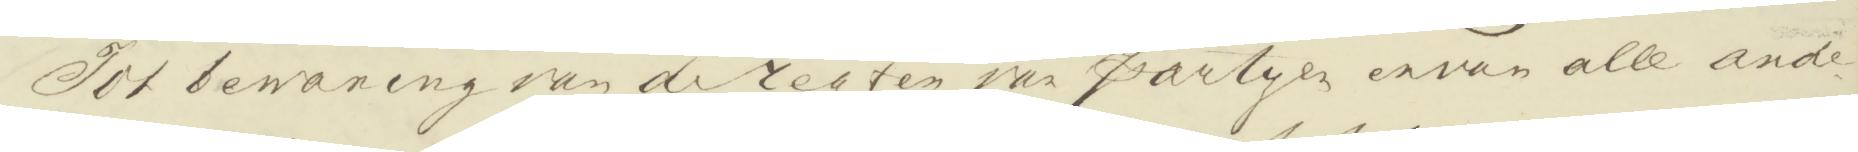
Tot bewaring van de regten van Partyen en van alle ande„
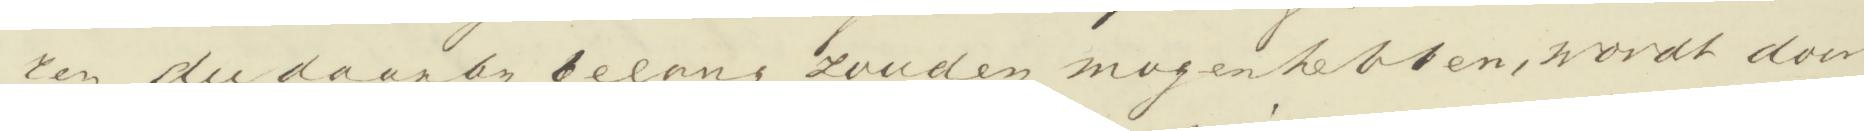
ren die daarby belang zouden mogen hebben, wordt door
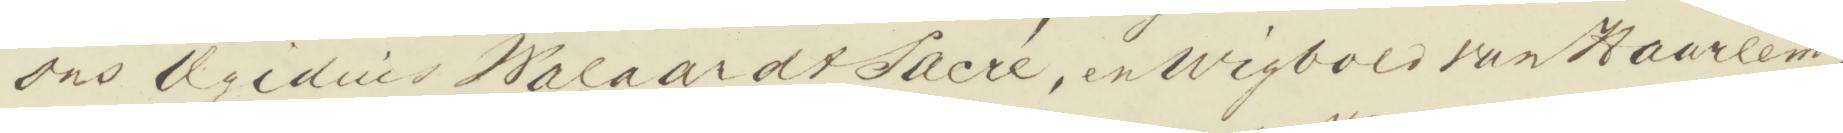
ons Agidus Walaardt Sacré, en Wigbold van Haarlem,
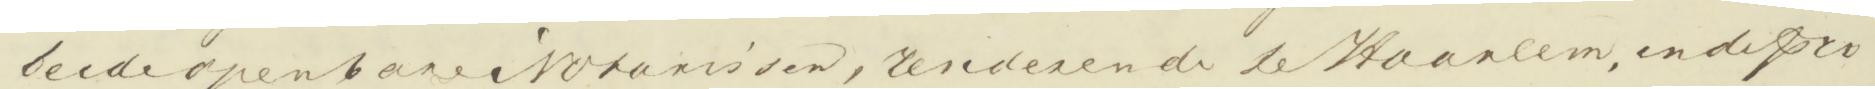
beide openbare Notarissen, residerende te Haarlem, in de pro
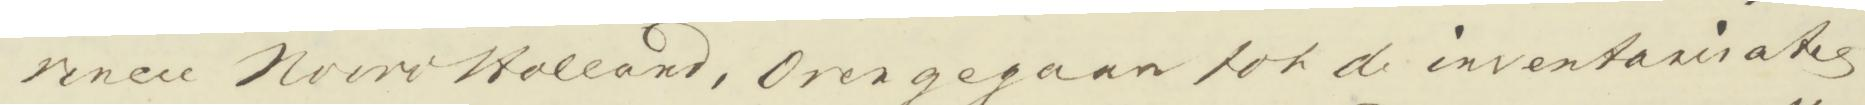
vincie Noord Holland, overgegaan tot de inventarisatie
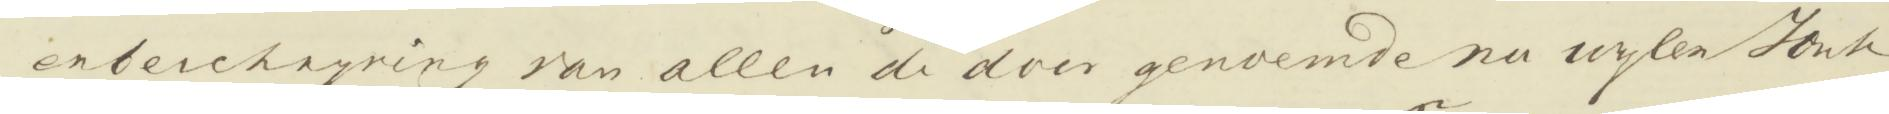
en beschryving van allen de door genoemde na wylen Ionk
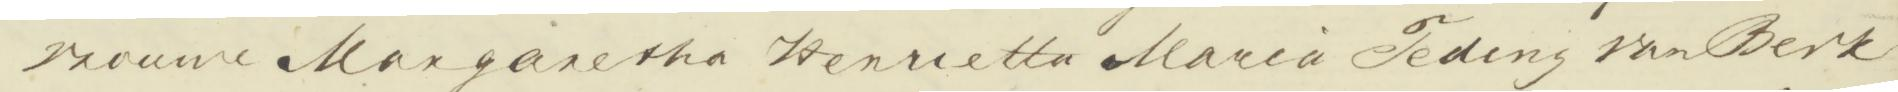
vrouwe Margaretha Henrietta Maria Teding van Berk
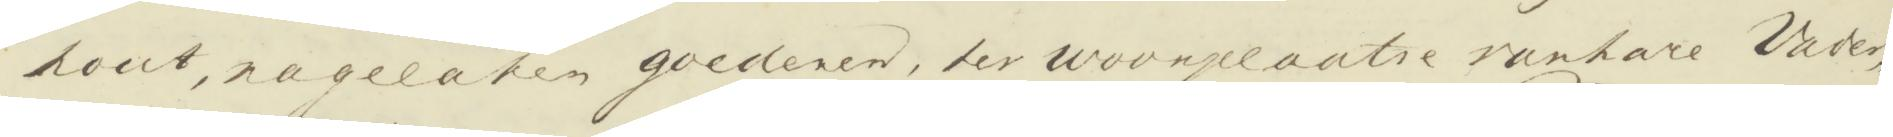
hout, nagelaten goederen, ter woonplaatse van hare Vader„
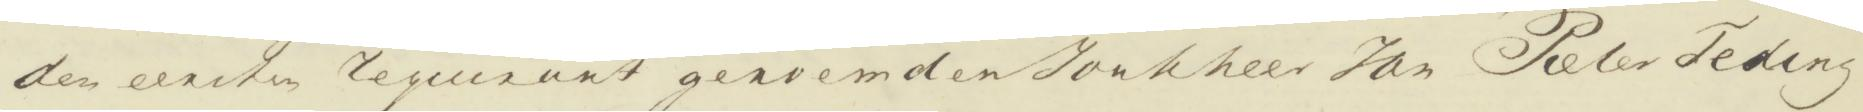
den eersten requirant genoemden Ionkheer Jan Pieter Teding
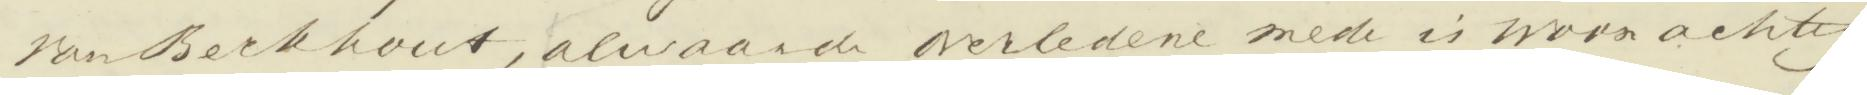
van Berkhout, alwaarde overledene mede is woonachtig
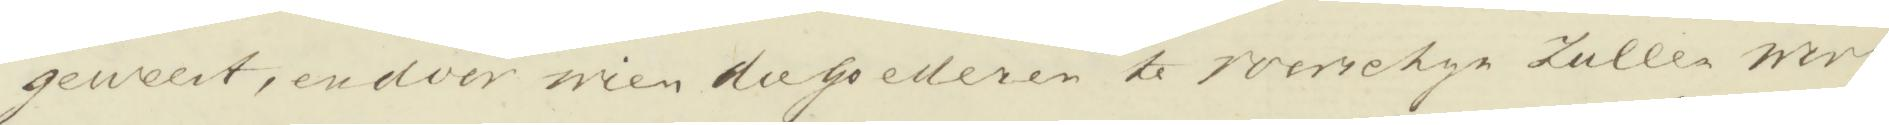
geweest, en door wien die goederen te voorschyn zullen wor
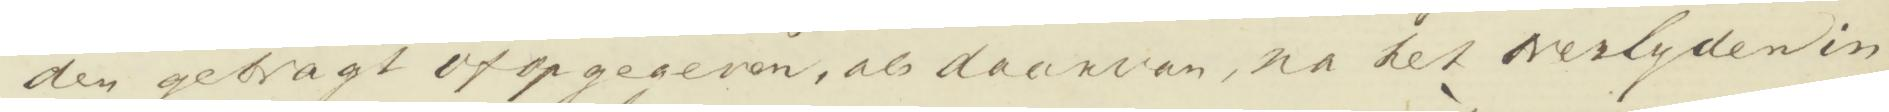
den gebragt of opgegeven, als daarvan, na het overlyden in
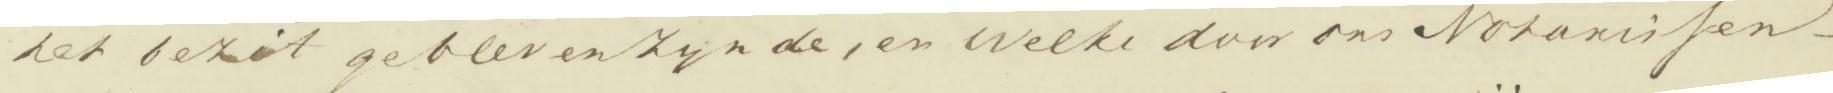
het bezit gebleven zijnde, en welke door ons Notarissen
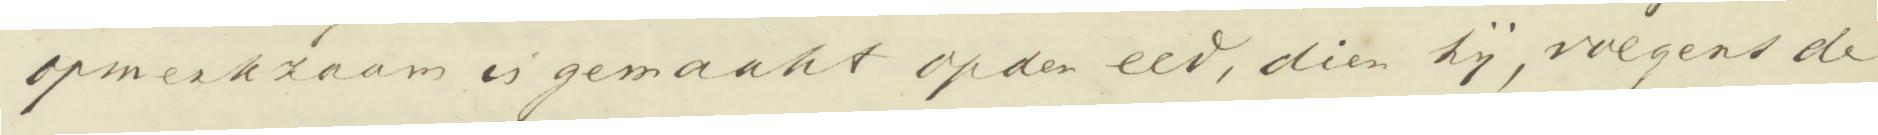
opmerkzaam is gemaakt op den eed, dien hij, volgens de
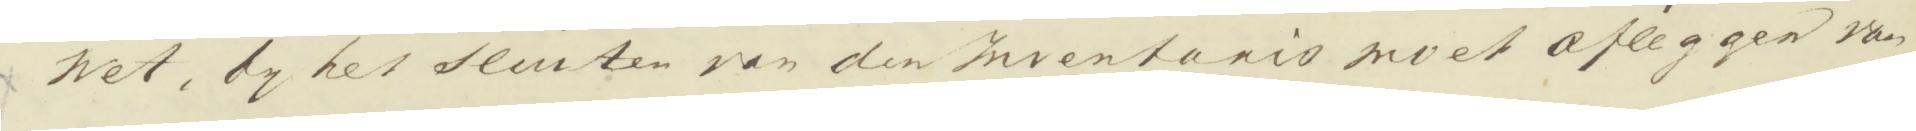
wet, by het sluiten van den Inventaris moet afleggen van
